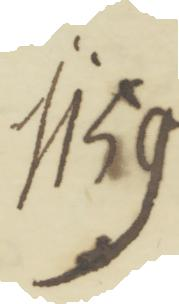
1159
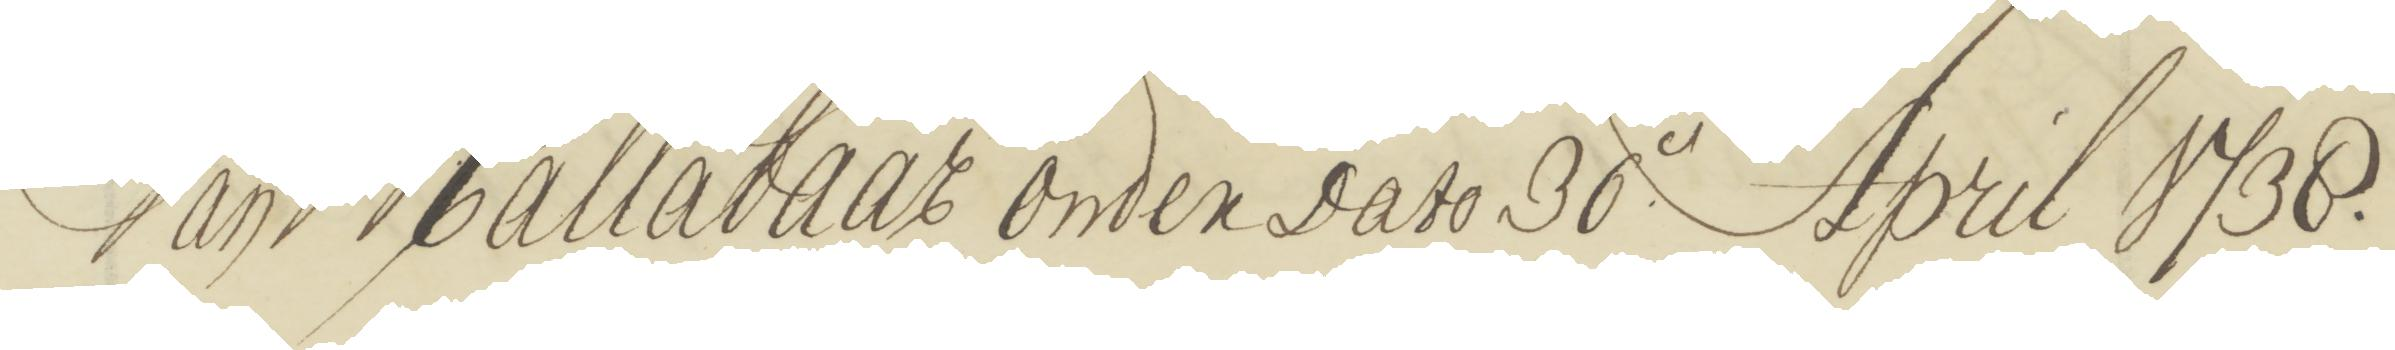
Van Mallabaar onder Dato 30:e April 1738.
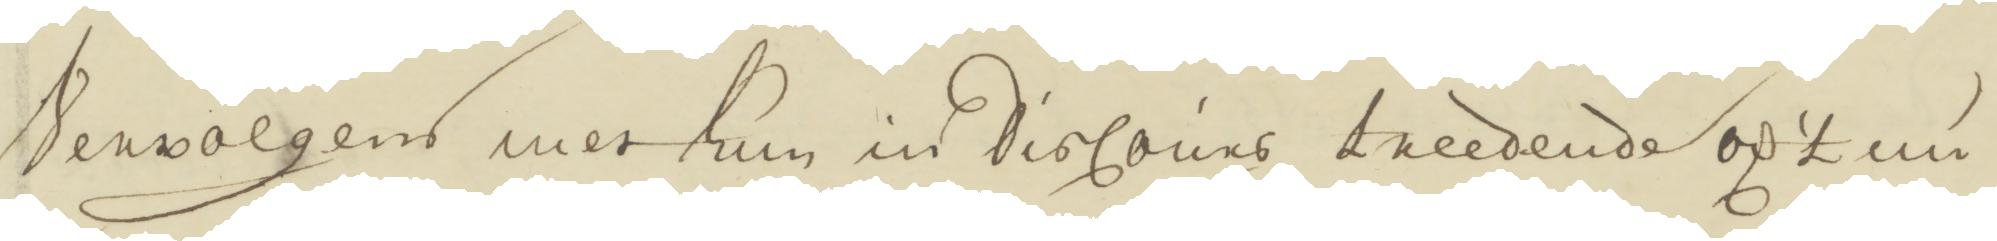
vervolgens met hun in discours treedende over ’t nu
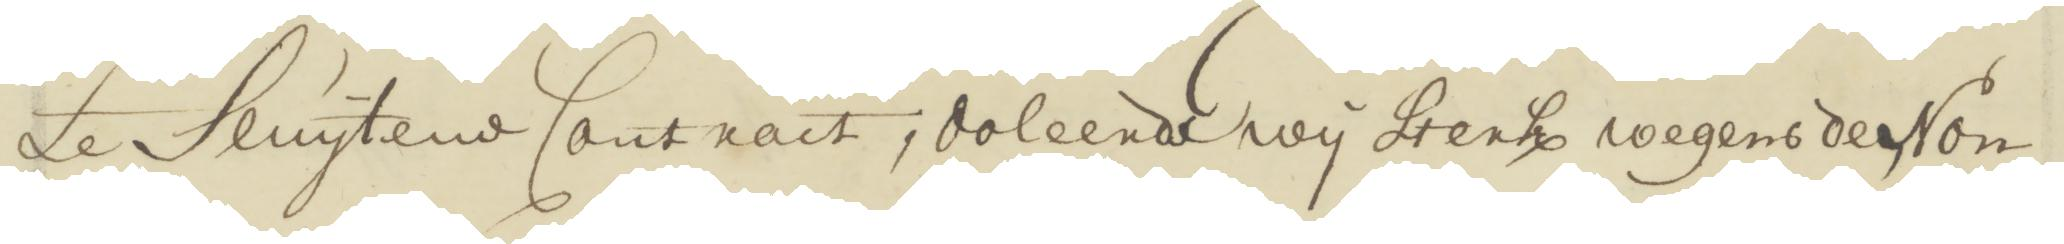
te sluijtene Contract, doleerde wij sterk wegens de Non
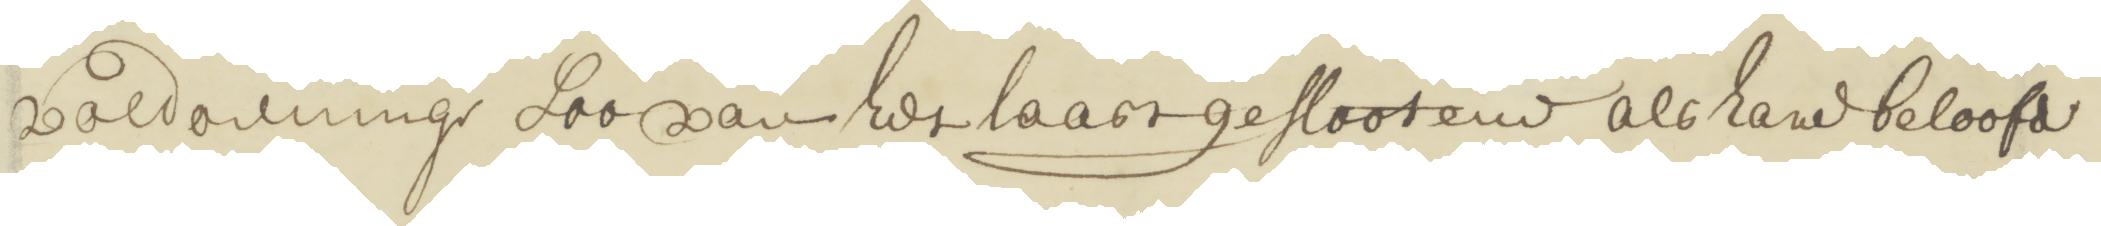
voldoening soo van het laast geslootene als hare beloofde
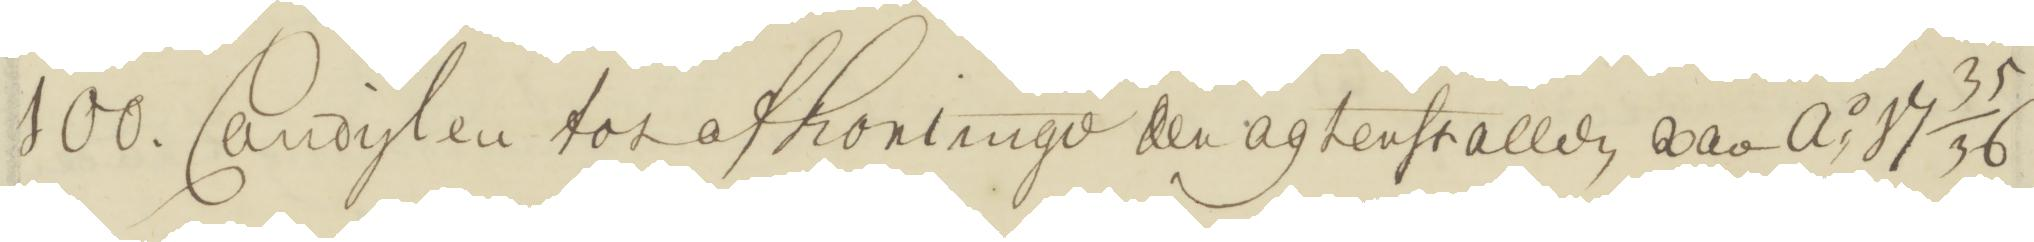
100. Candijlen tot afkortinge der agterstallen van A„o 17 35/36
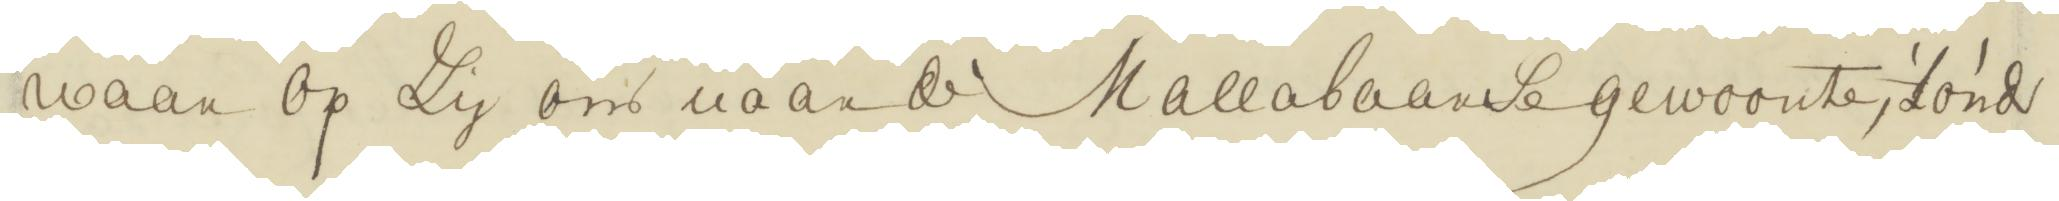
waar op zij ons naar de Mallabaarse gewoonte, 't oude
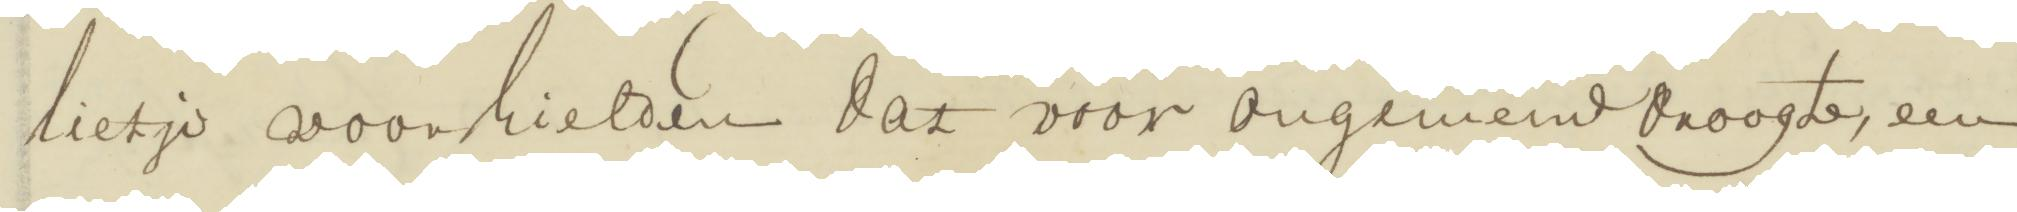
lietje voorhielden dat voor ongemene droogte, een
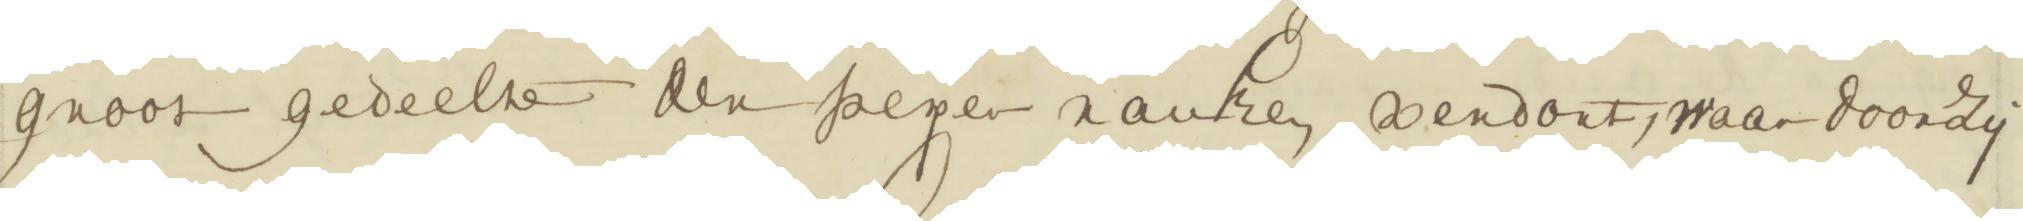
groot gedeelte der peper ranken verdort, waar door zij
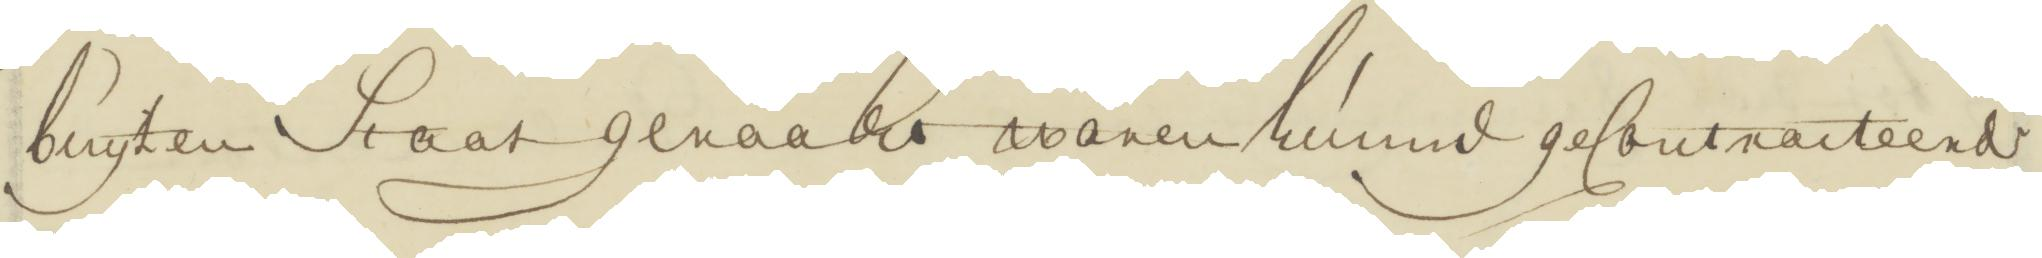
buijten staat geraakt waren hunne gecontracteerde
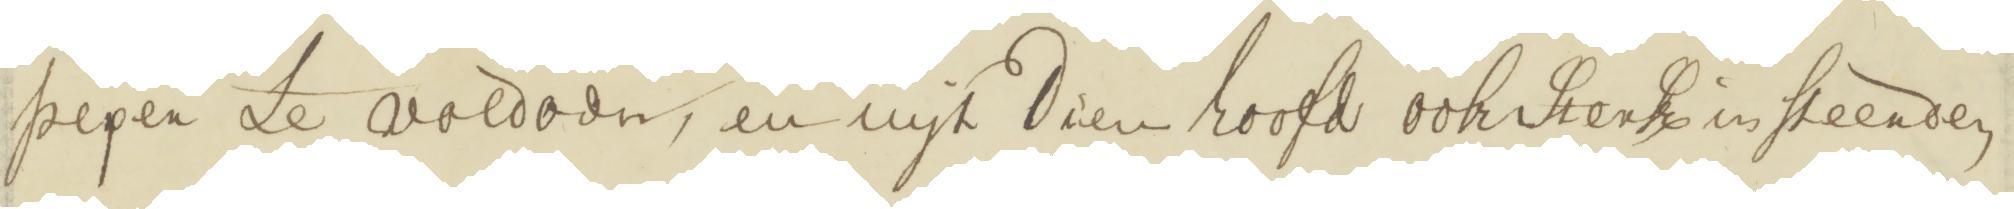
peper te voldoen, en uijt dien hoofd ook sterk insteerden
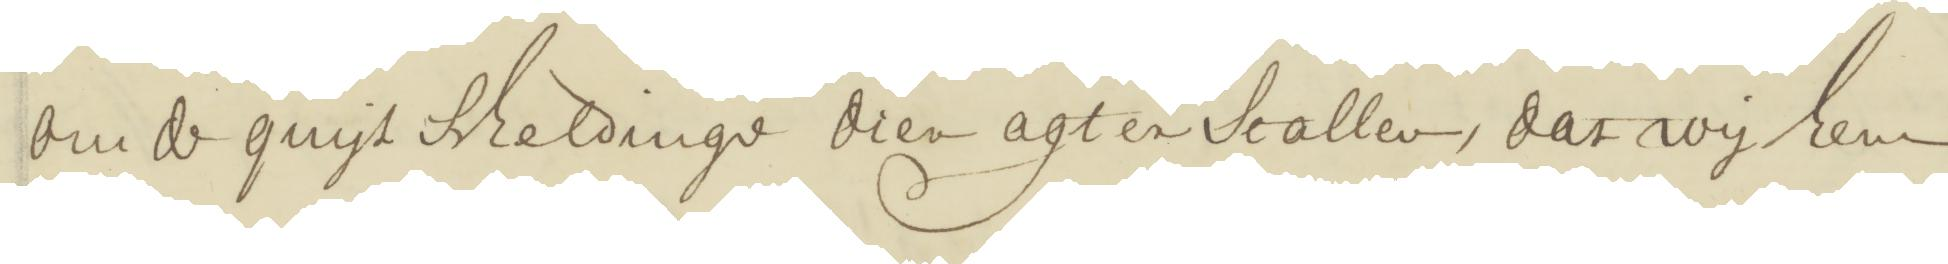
om de quijt scheldinge dier agter stallen, dat wij hem
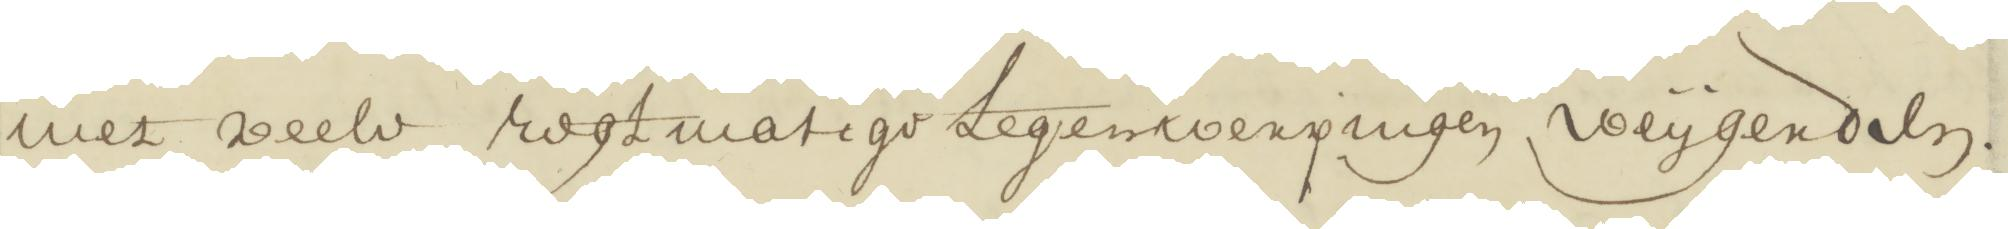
met veele regtmatige tegenwerpingen, weijgerden.
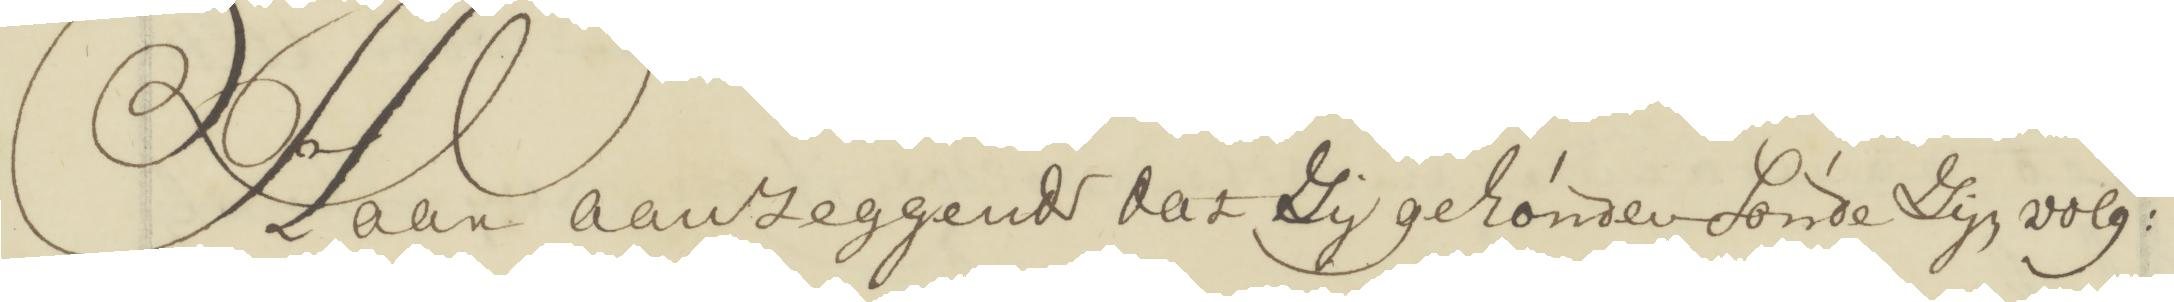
Haar aanzeggende dat zij gehouden soude zijn volg:s
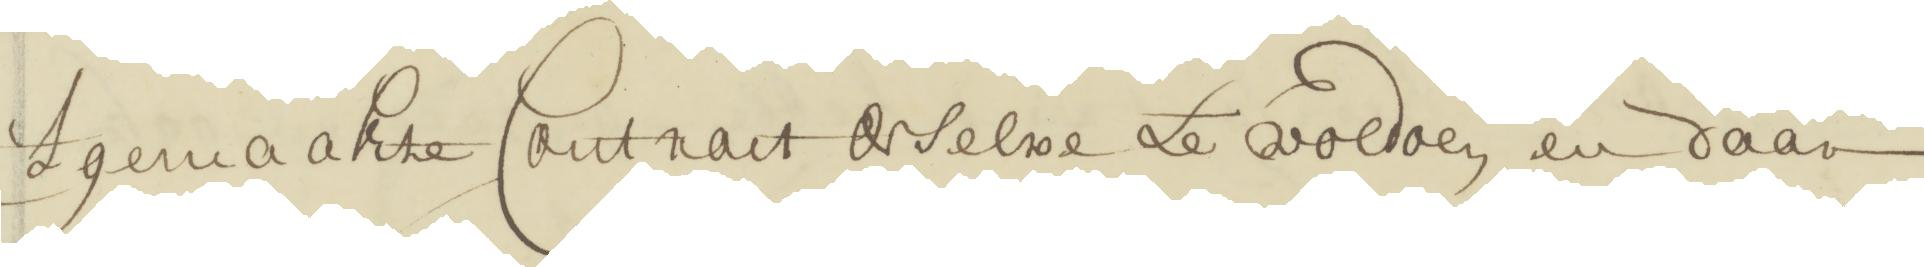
't gemaakte Contract deselve te voldoen en daar
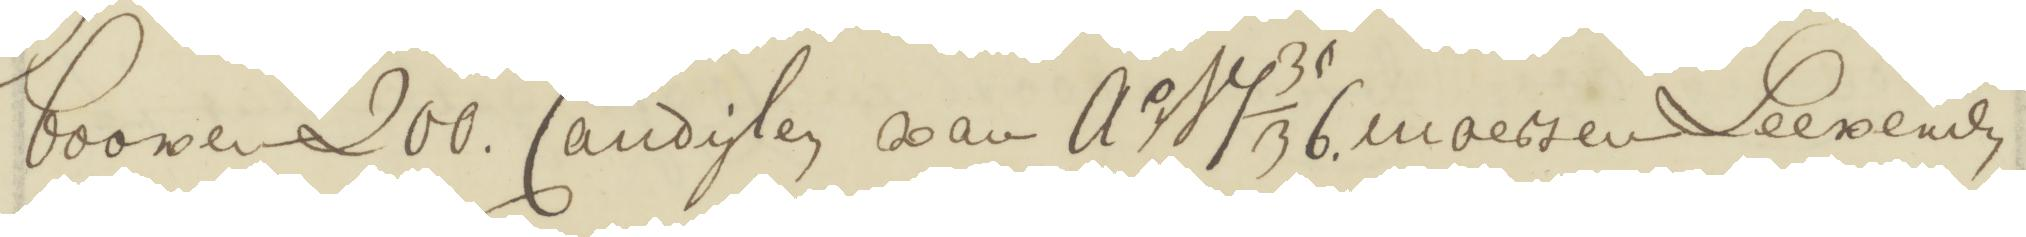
booven 200. Candijlen van A„o 17 35/36. moesten leeveren
